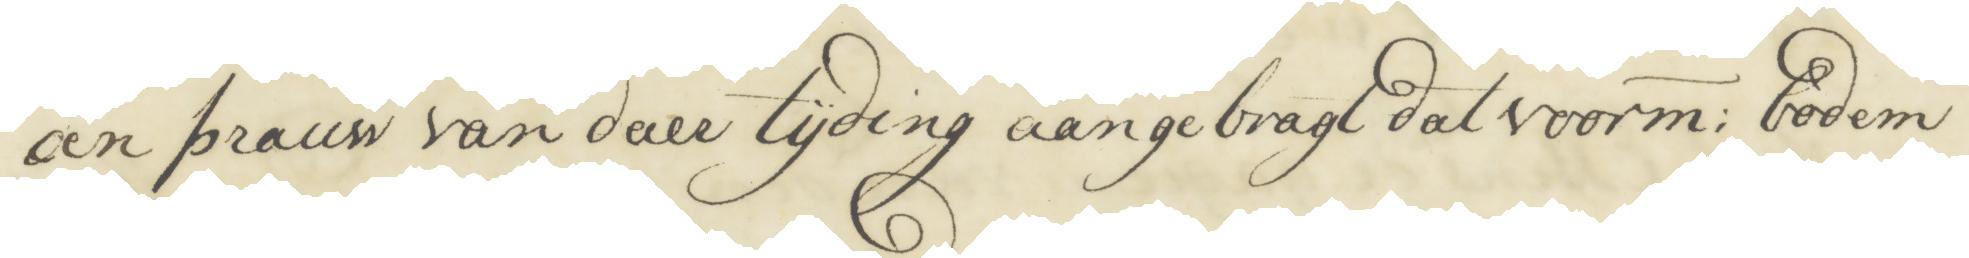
den prauw van daer tijding aangebragt dat voorm: bodem
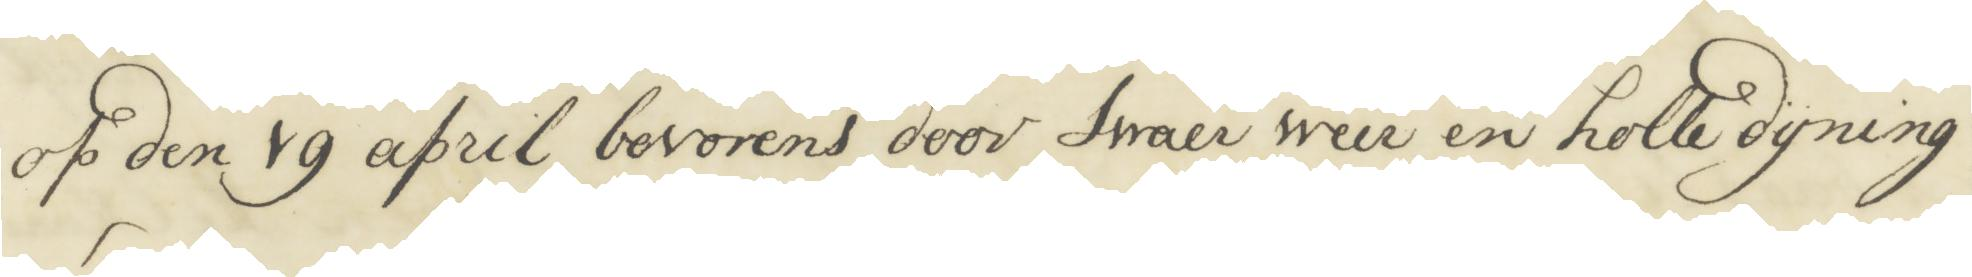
op den 19 april bevorens door swaer weer en holle dijning
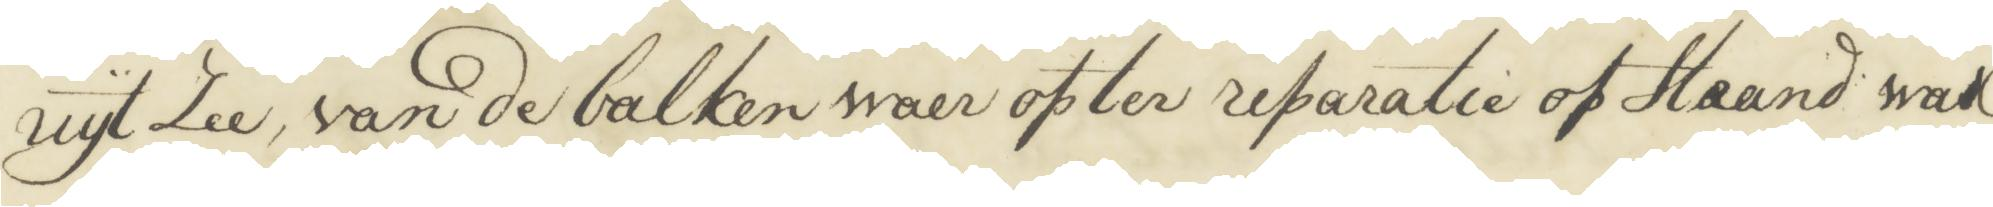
uijt zee, van de balken waer op ter reparatie op staand wat
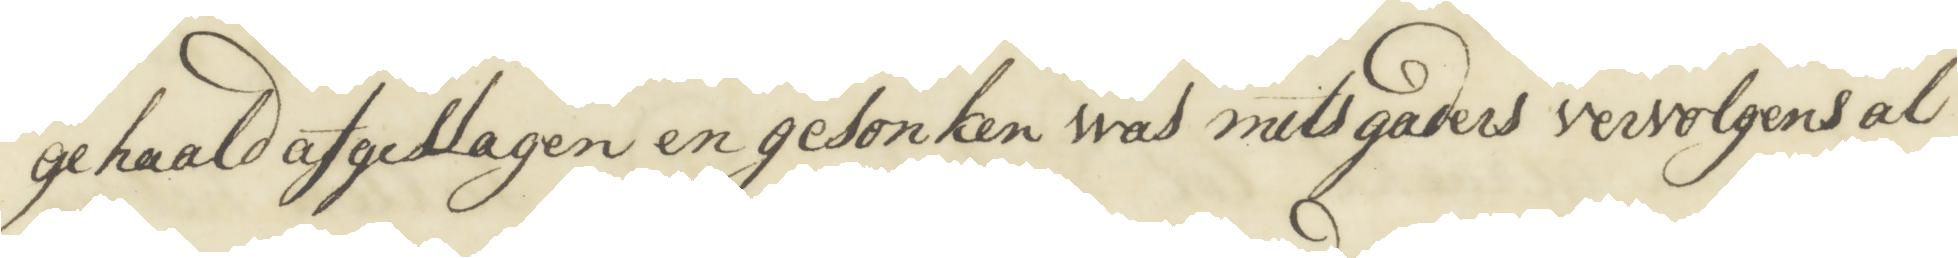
gehaald afgeslagen en gesonken was mitsgaders vervolgens al
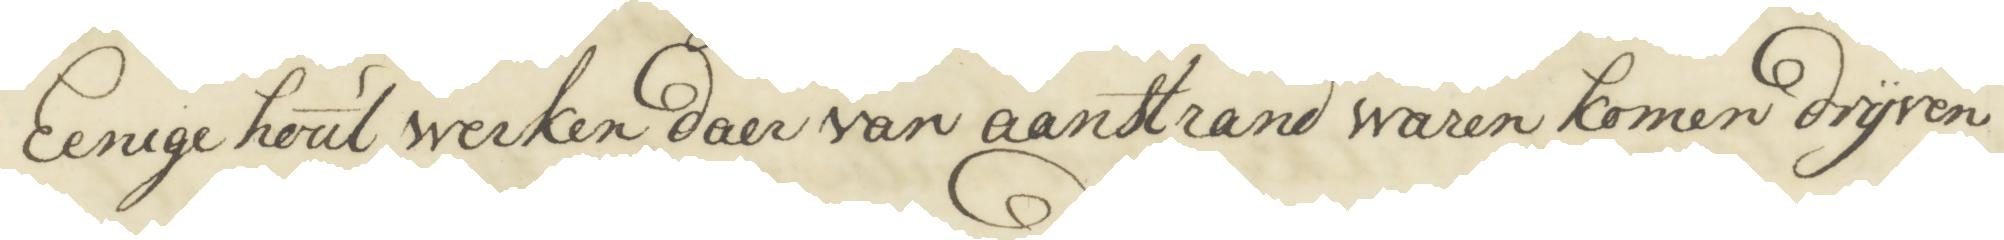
Eenige hout werken daer van aanstrand waren komen drijven
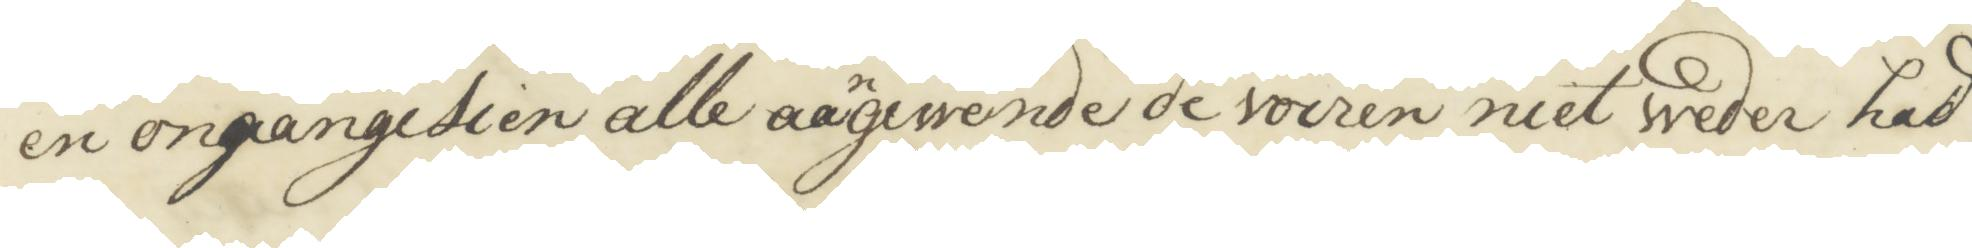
en onaangesien alle aangewende de voiren niet weder had
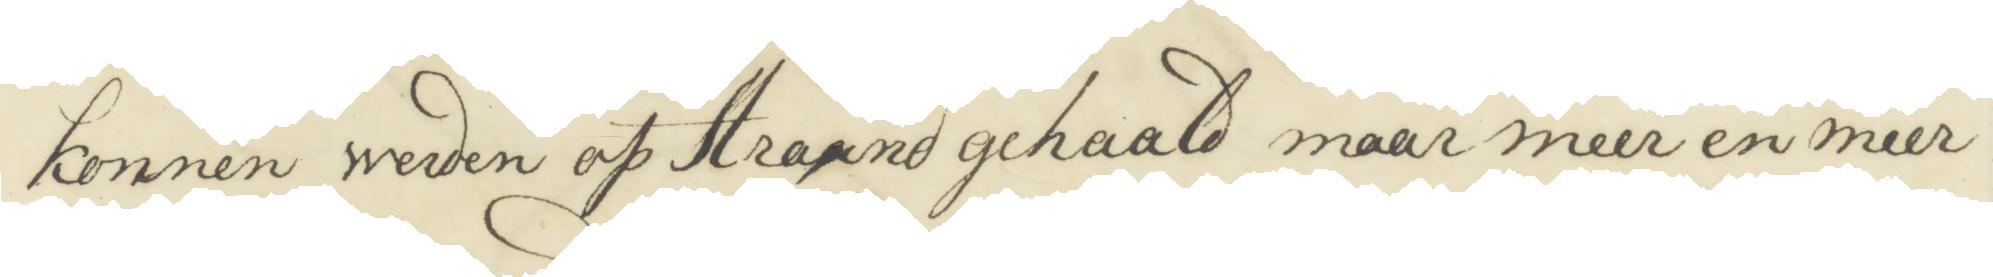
konnen werden op straand gehaald maar meer en meer
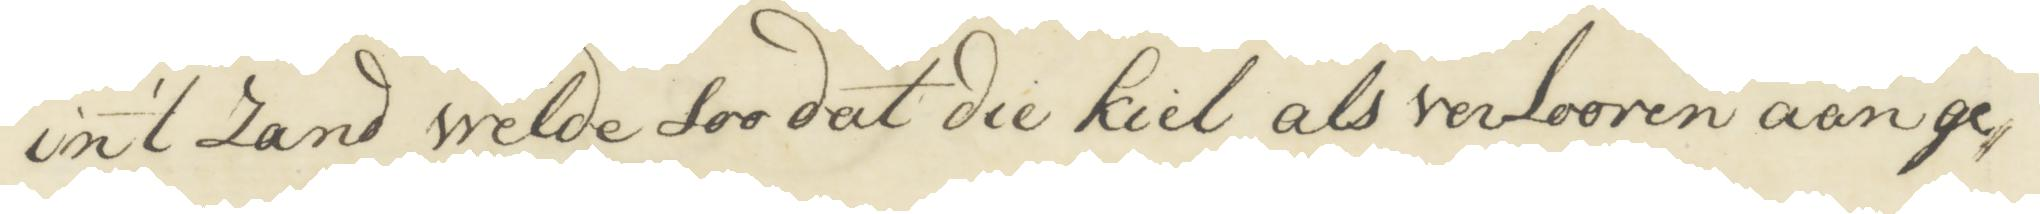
in’t zand welde soo dat die kiel als verlooren aan ge„
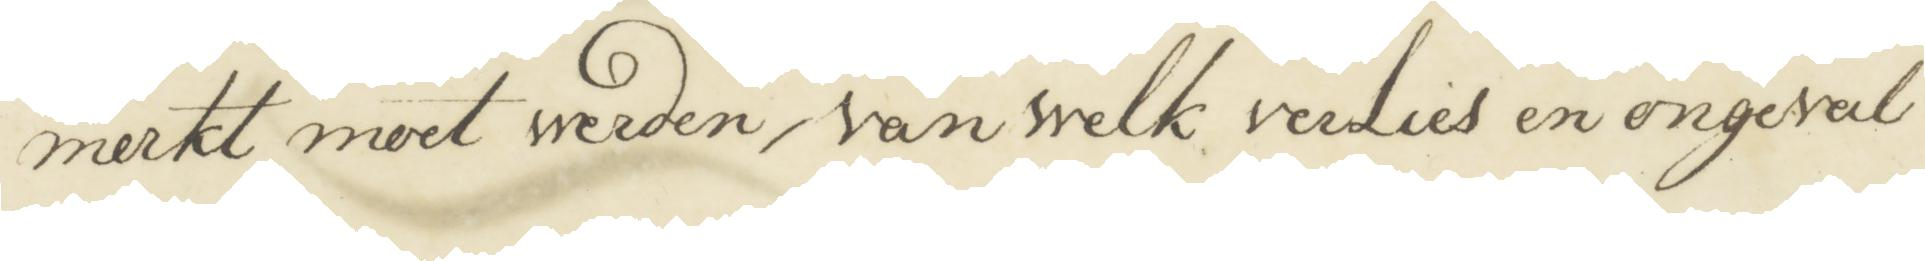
merkt moet werden, van welk verlies en ongeval
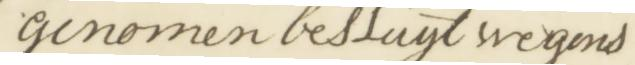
genomen besluijt wegens
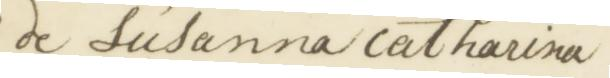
de susanna catharina
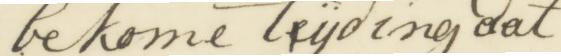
bekome teijding dat
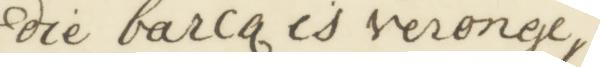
die barcq is veronge„
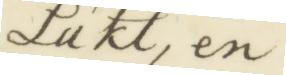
Lukt, en
